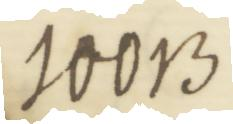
10013
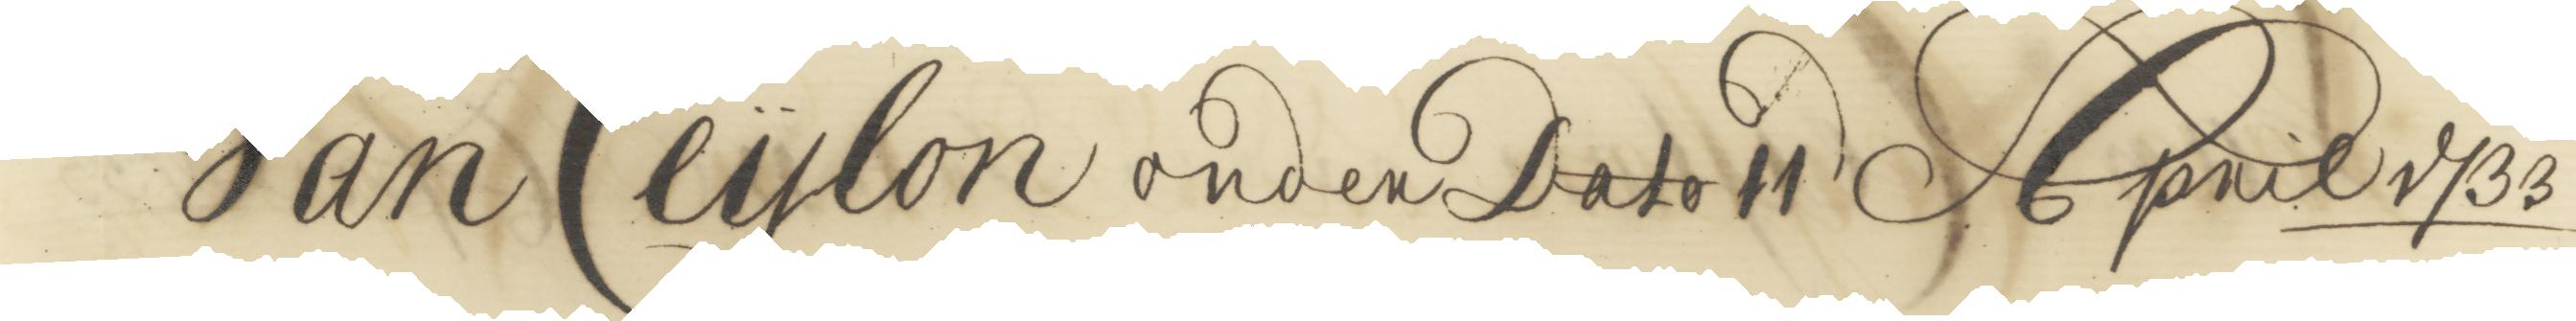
Van Ceijlon onder Dato 11e April 1733
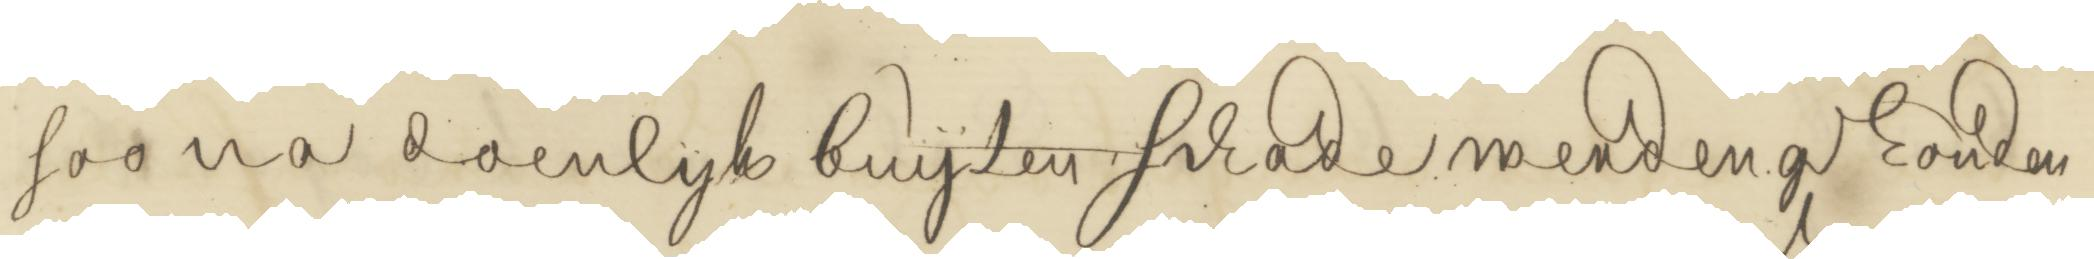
soo na doenlijk buijten schade werden gehouden
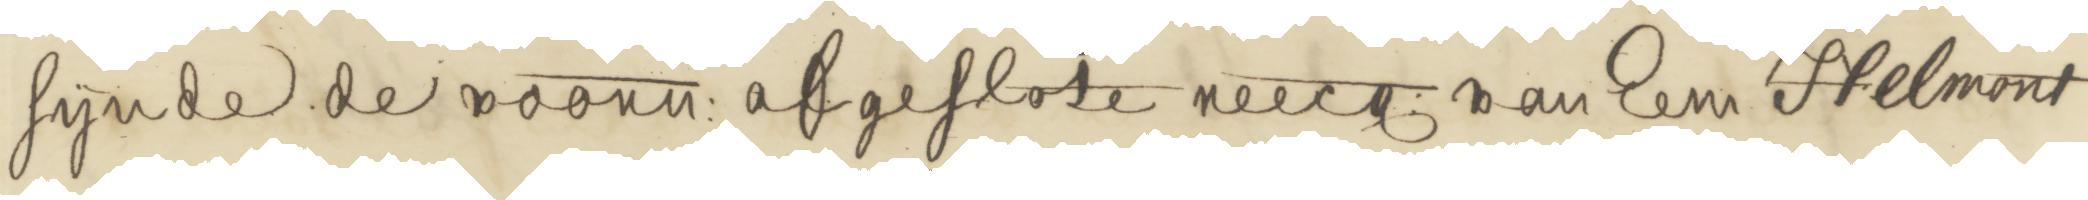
sijn de de voorn: afgeslote reecq: van hem Helmont
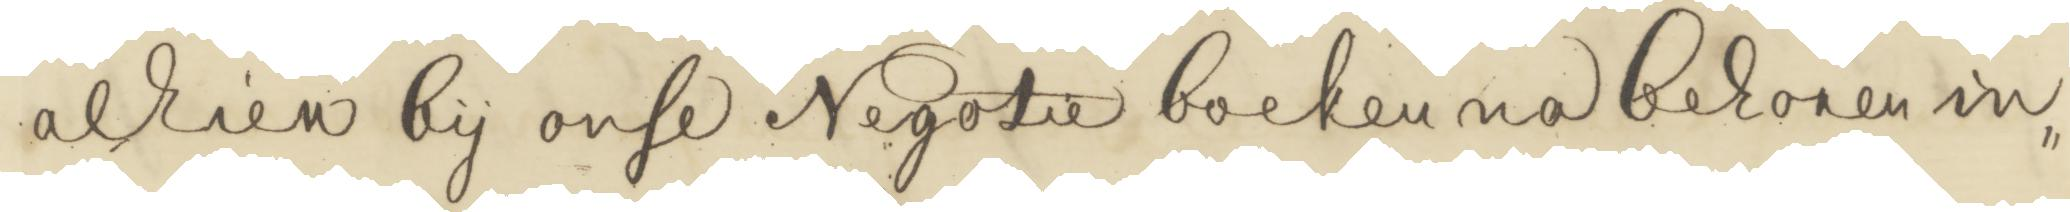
alhier bij onse Negotie boeken na behoren in„
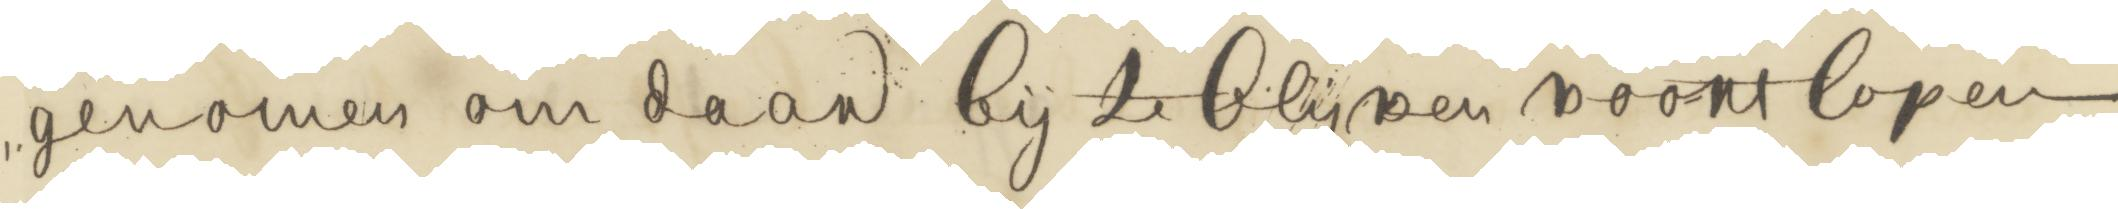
„genomen om daar bij te blijven voortlopen
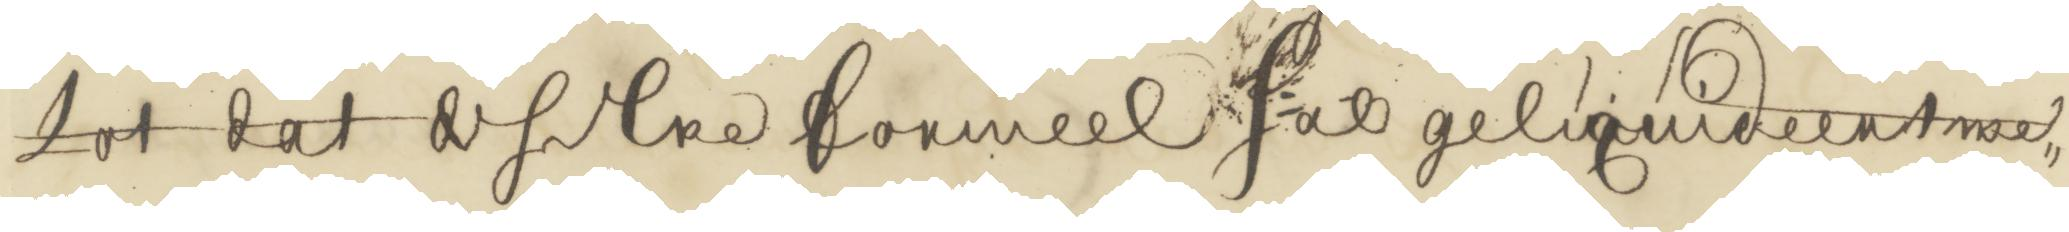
tot dat deselve formeel Sal geliquideert we„
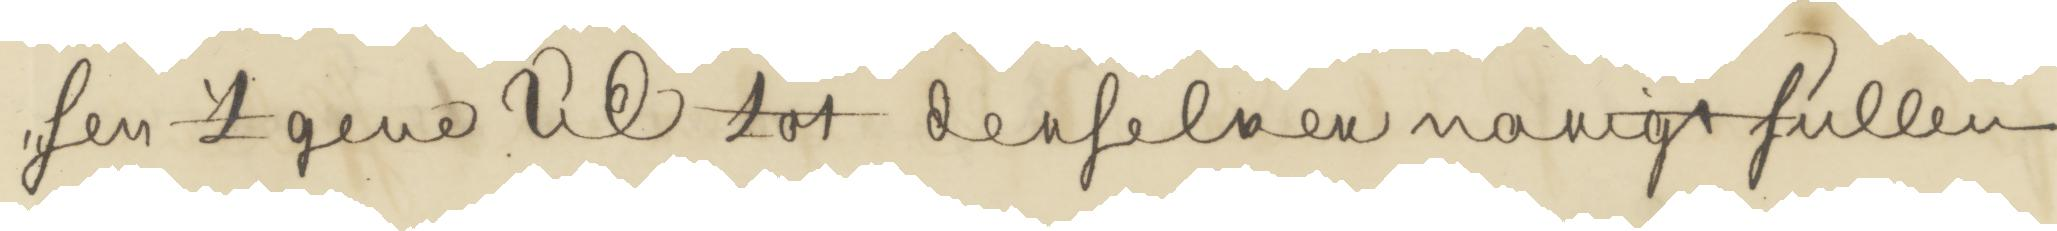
„sen ’t gene UE tot derselver narigt sullen
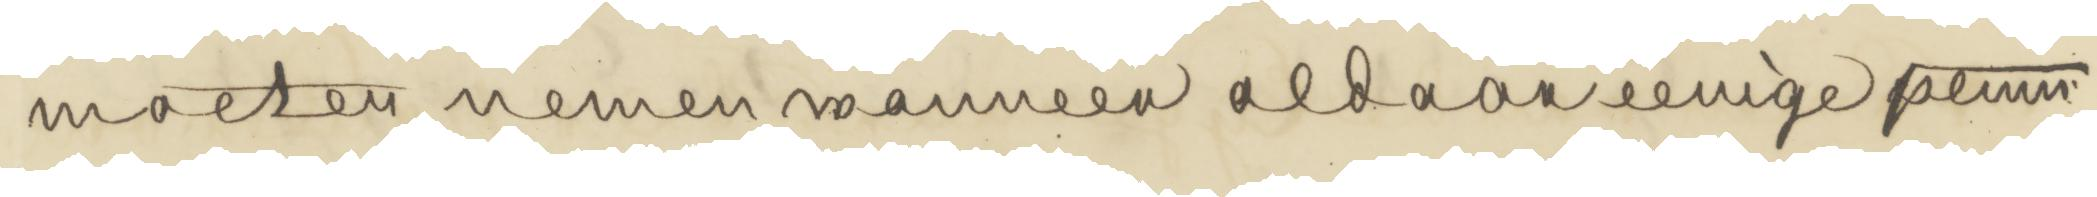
moeten nemen wanneer aldaar eenige penn:
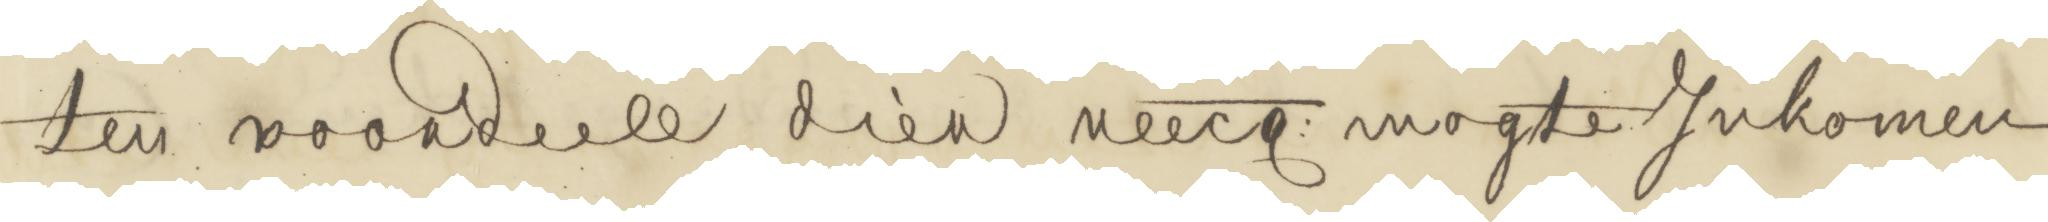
ten voordeele dier reecq: mogte Jnkomen
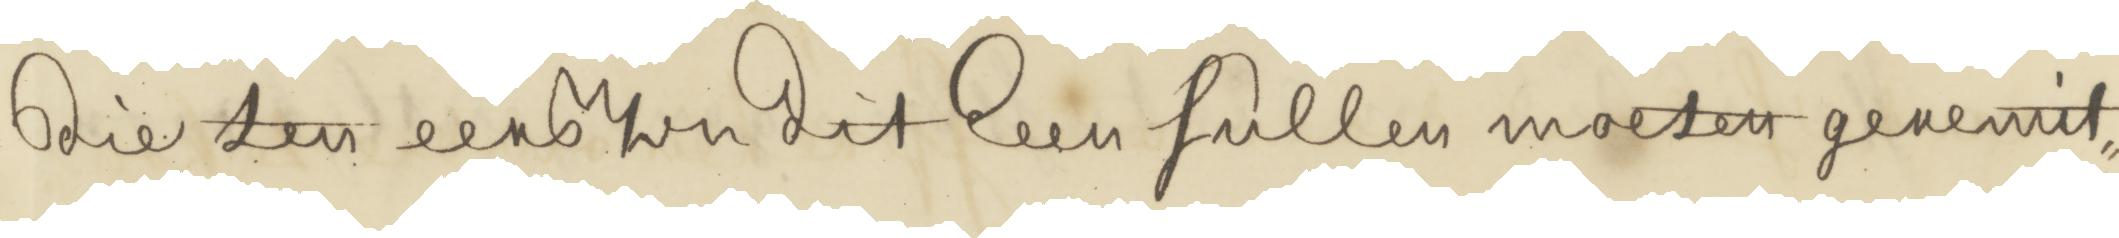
die ten eersten dit heen sullen moeten geremit„
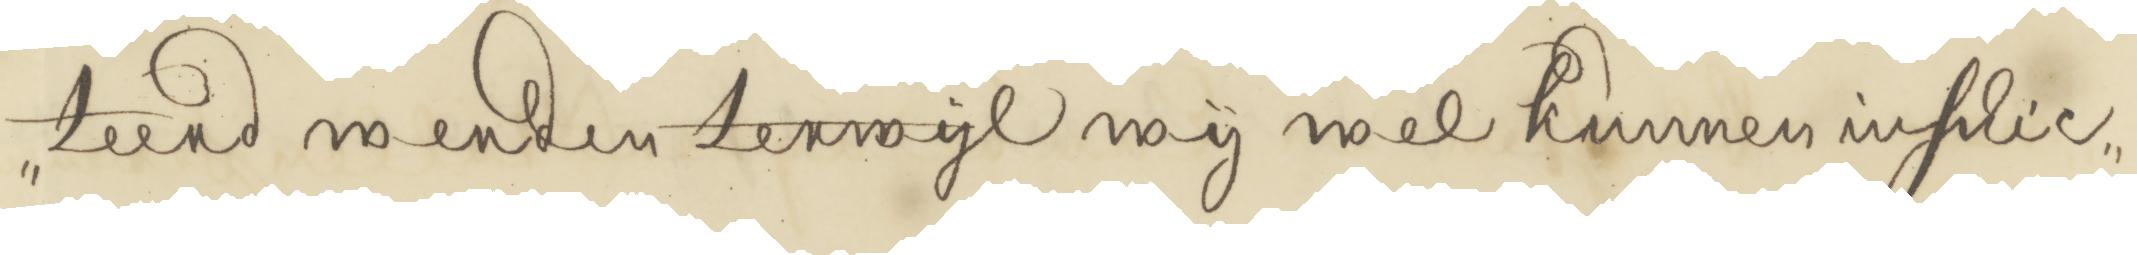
teerd werden terwijl wij wel kunnen inschic„
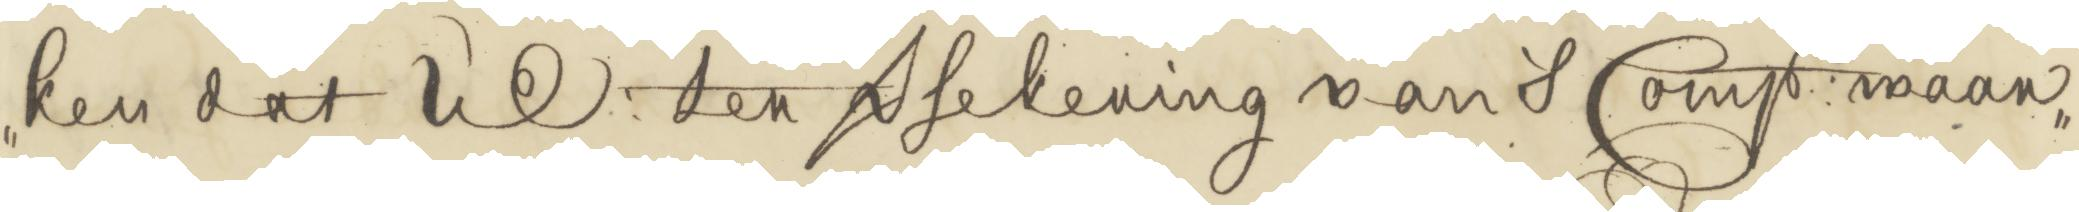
„ken dat UE: ter versekering van ’s Comp:s waar„
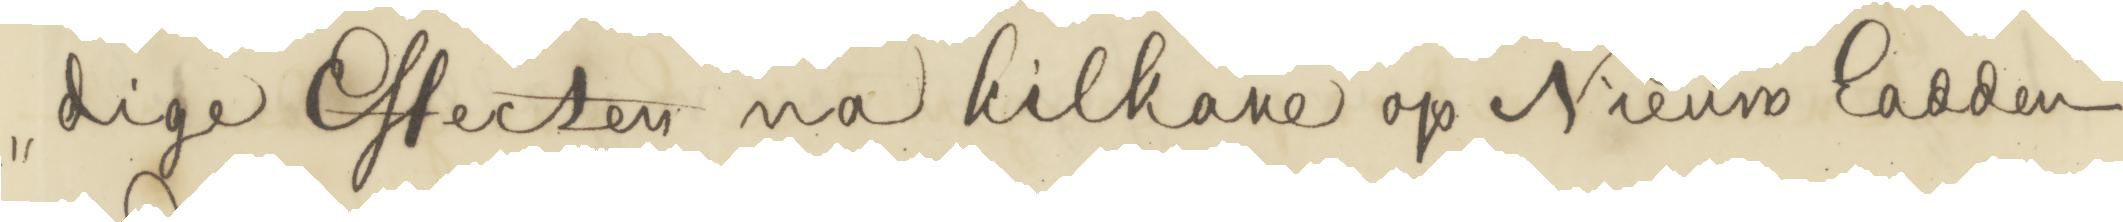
„dige Effecten na kilkare op Nieuw hadden
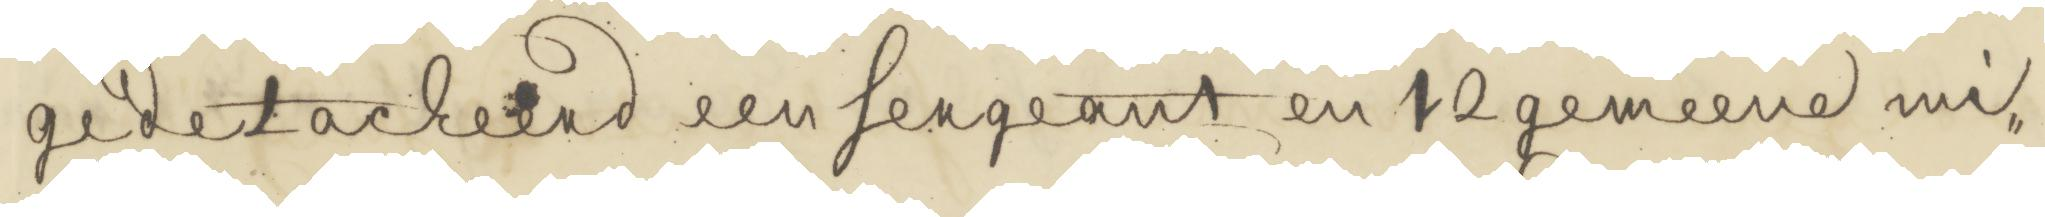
gedetacheerd een sergeant en 12 gemeene mi„
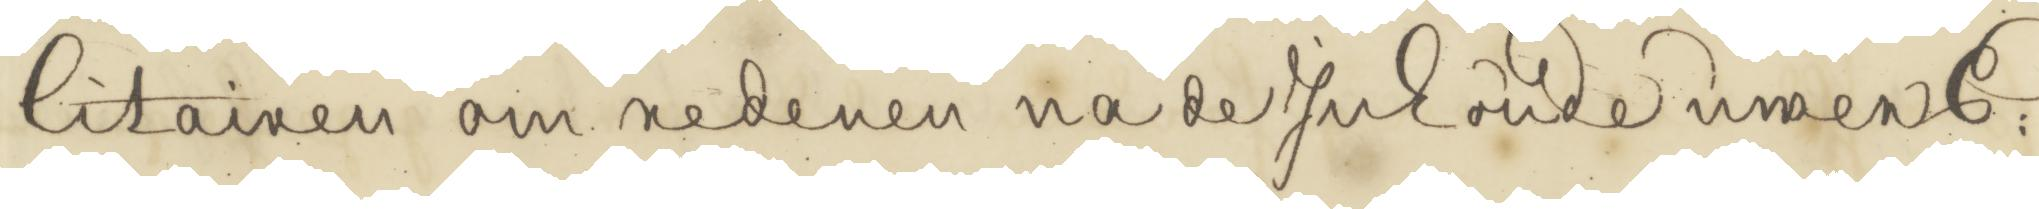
litairen om rederen na de Jnhoude uwer E:
